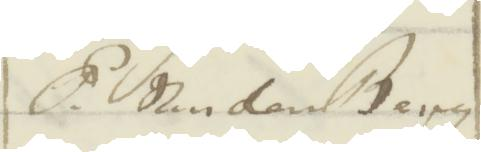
P. Van den Berg
